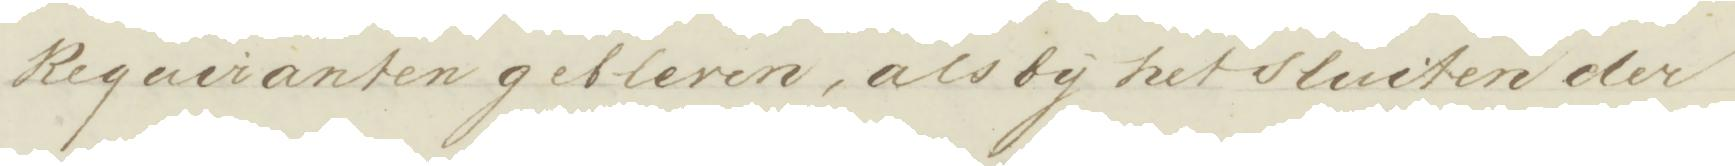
Requiranten gebleven, als bij het sluiten der
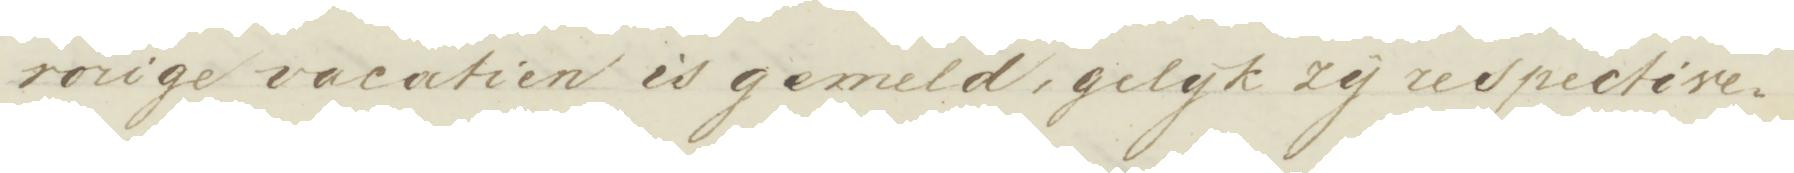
vorige vacatien is gemeld, gelijk zij respective„
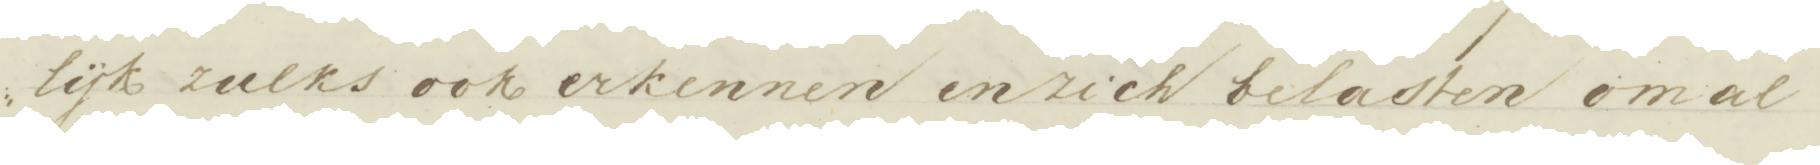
„lijk zulks ook erkennen en zich belasten om al
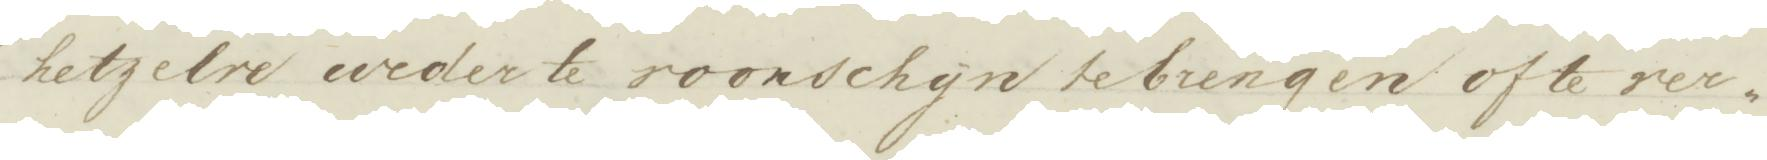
hetzelve weder te voorschijn te brengen of te ver„
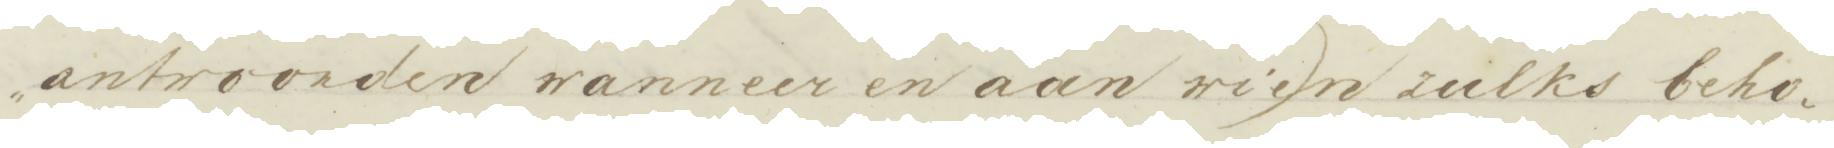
„antwoorden wanneer en aan wien zulks beho„
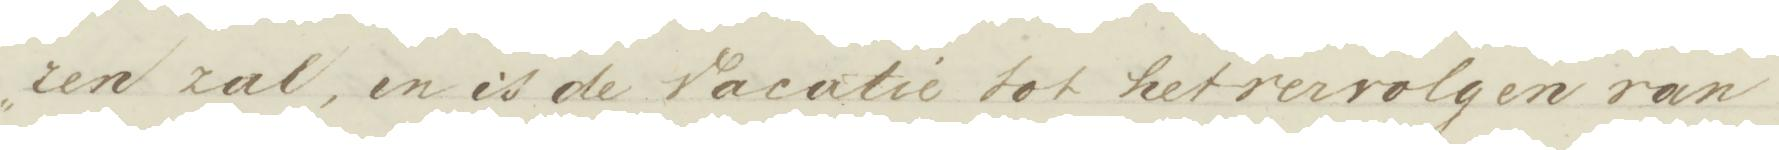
„ren zal, en is de Vacatie tot het vervolgen van
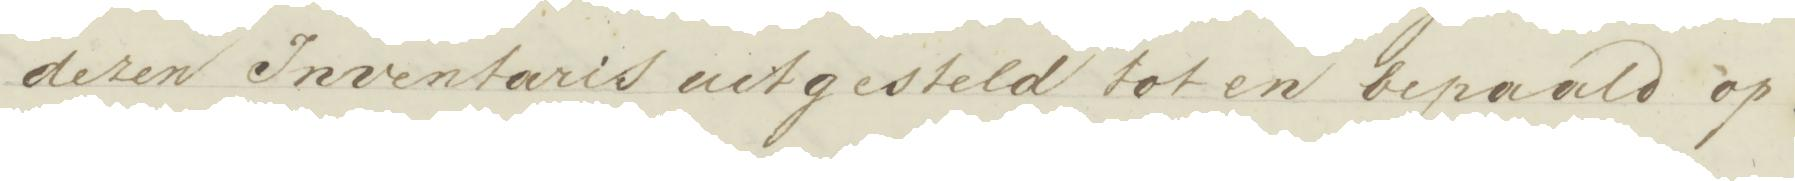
dezen Inventaris uitgesteld tot en bepaald op
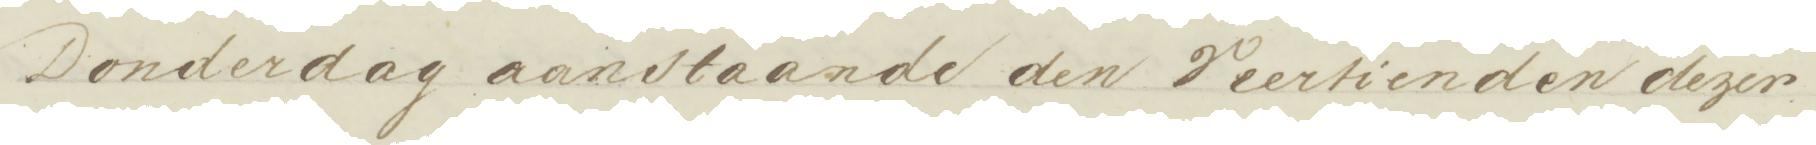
Donderdag aanstaande den Veertienden dezer
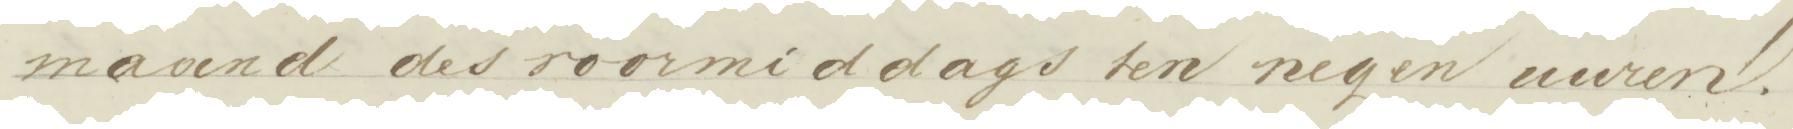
maand des voormiddags ten negen uuren.
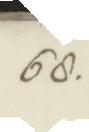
68.
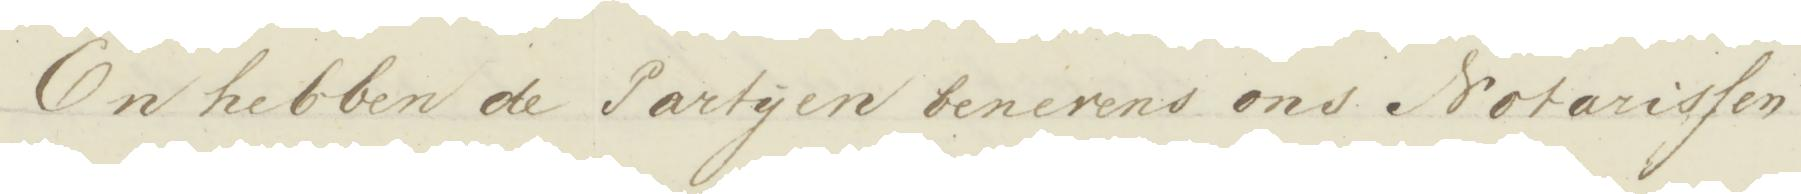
En hebben de Partijen benevens ons Notarissen
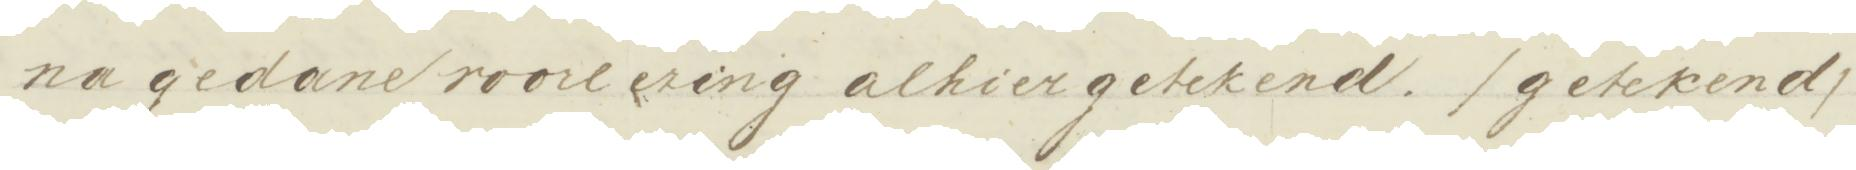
na gedane voorlezing alhier getekend. /getekend/
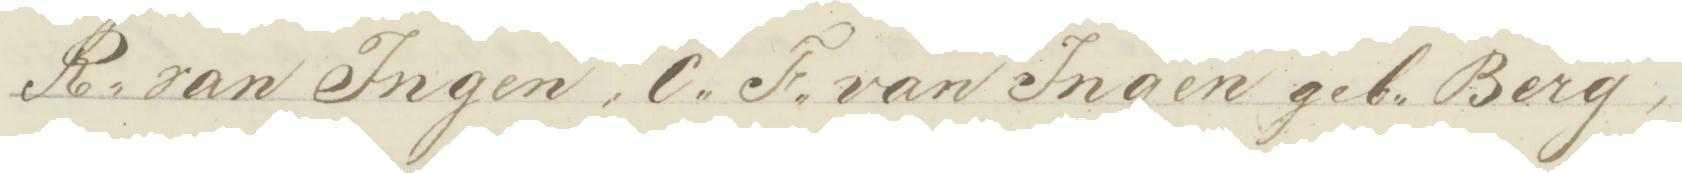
R„ van Ingen, C„ F„ van Ingen geb„ Berg,
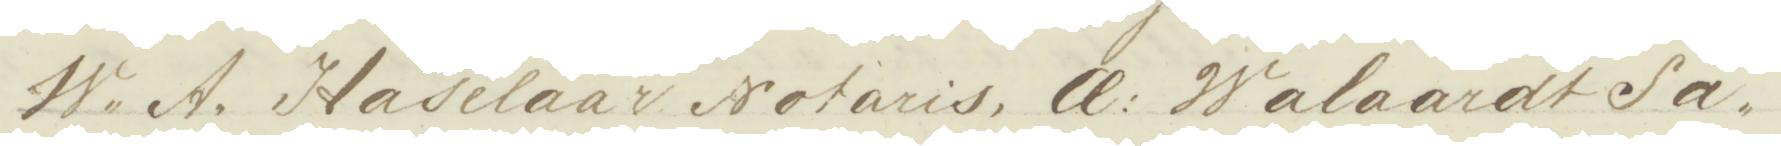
W. A. Haselaar Notaris, Ae: Walaardt Sa„
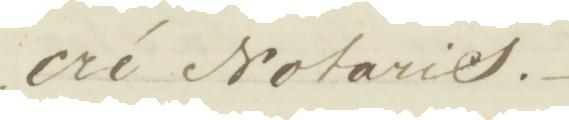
cré Notaris.
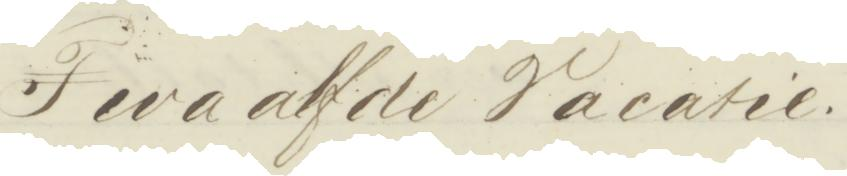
Twaalfde Vacatie.
